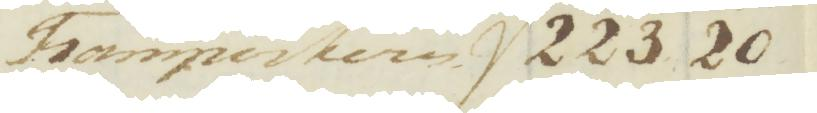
Transportere ƒ 223. 20
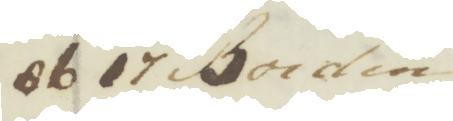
86 17 Borden
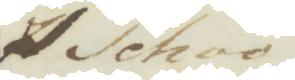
J Schoo
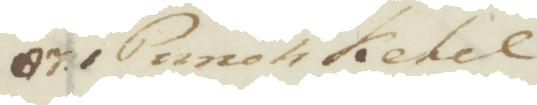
87 1 Punch Ketel
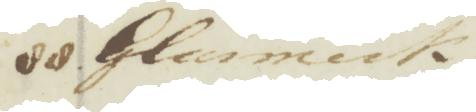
88 Glasmeck
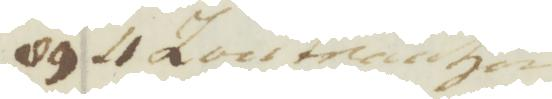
89 4 Zoutvaatjen
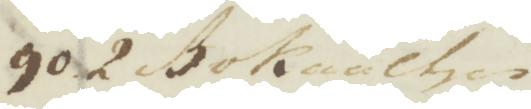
90. 2 Bokaaltjes
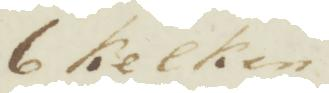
6 kelken
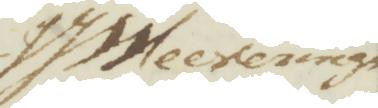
JJWeeveringh
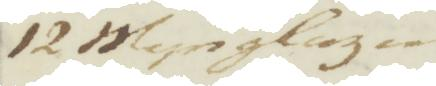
12 Wijn glazen
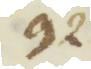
92.
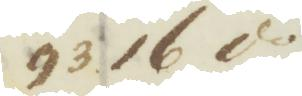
93. 16 d:o
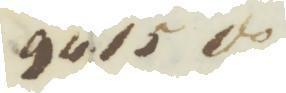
94. 15 d:o
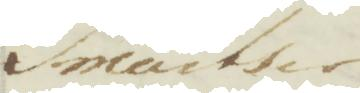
Swartjes
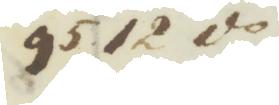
95. 12 d:o
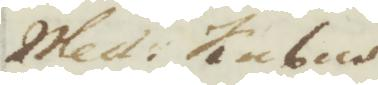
Wed: Kubus
